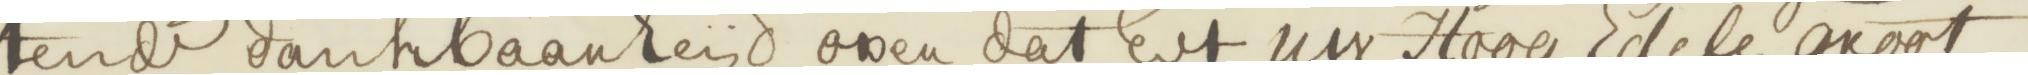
tende dankbaarheijd over dat het uw Hoog Edele groot
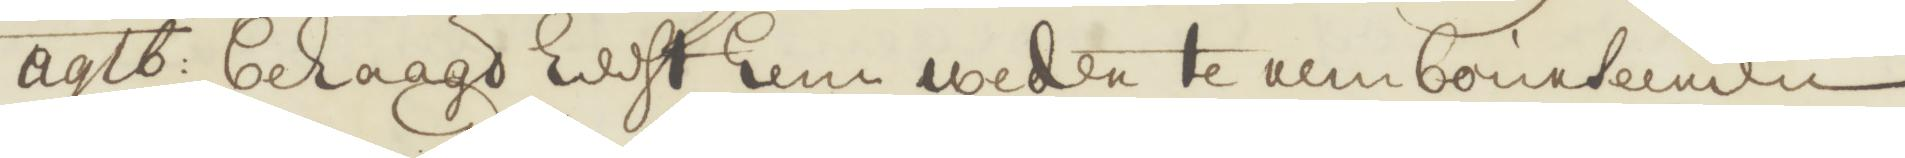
agtb: behaagd heeft hem weder te rembourseeren
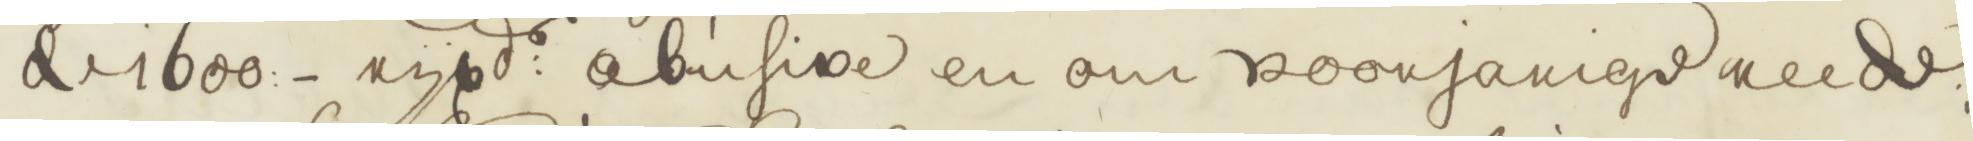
de 1600:- rijxd:s abusive en om voorjarige reede
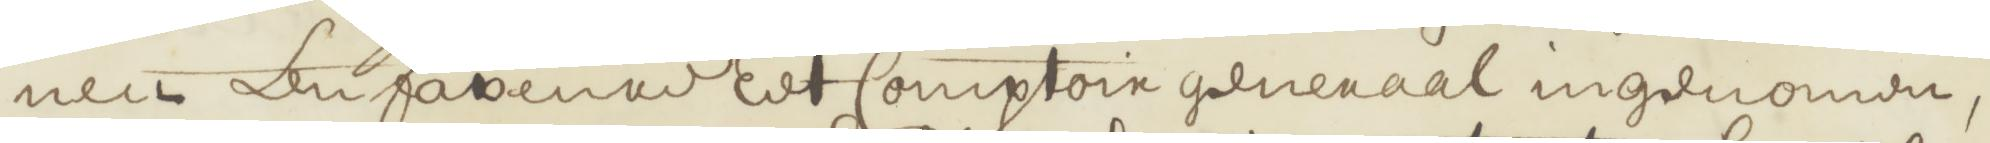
nen ten faveure het Comptoir generaal ingenomen,
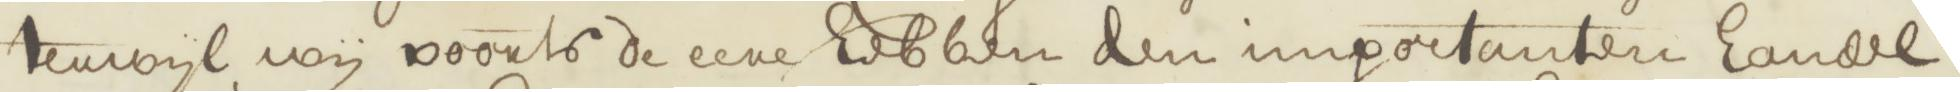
terwijl wij voorts de eere hebben den importanten handel
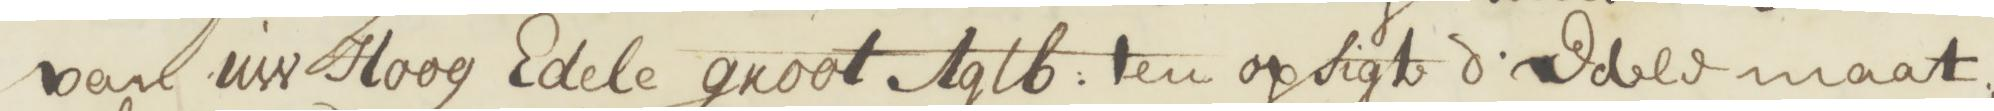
van uw Hoog Edele groot Agtb: ten opsigt d’ Edele maat„
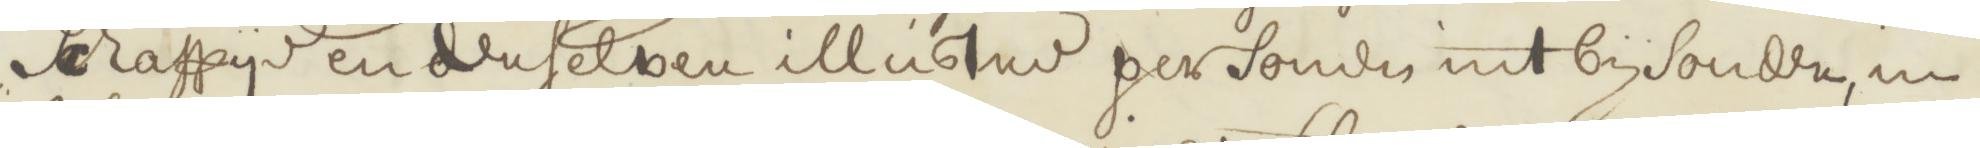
schappije en derselven illustre personen int bijsonder, in
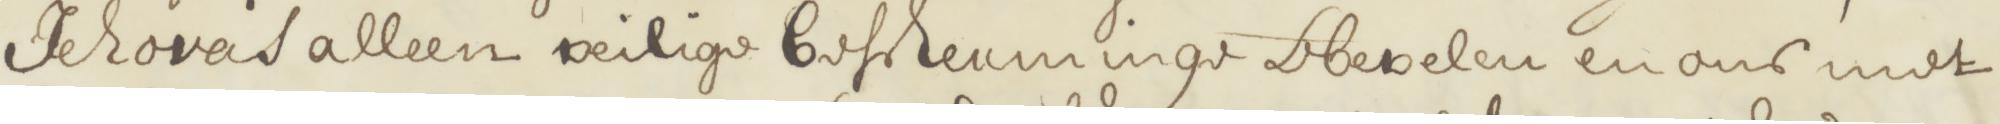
Jehovas alleen veilige bescherminge tebevelen en ons met
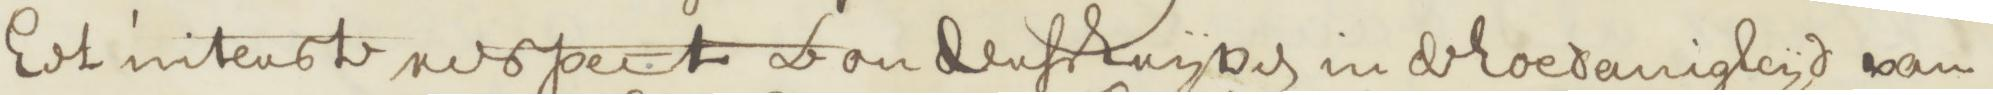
het uiterste respect te onderschrijven in dehoedanigheijd van
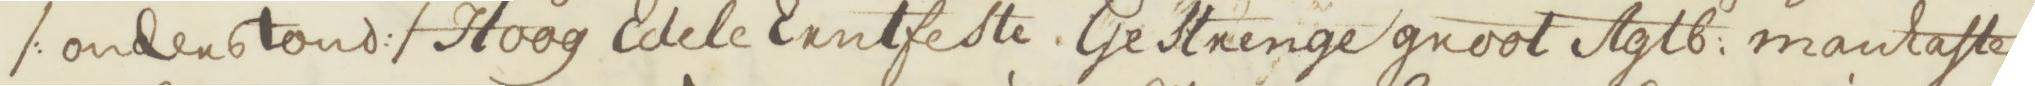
/:onderstond:/ Hoog Edele Erntfeste Gestrenge groot Agtb: manhafte
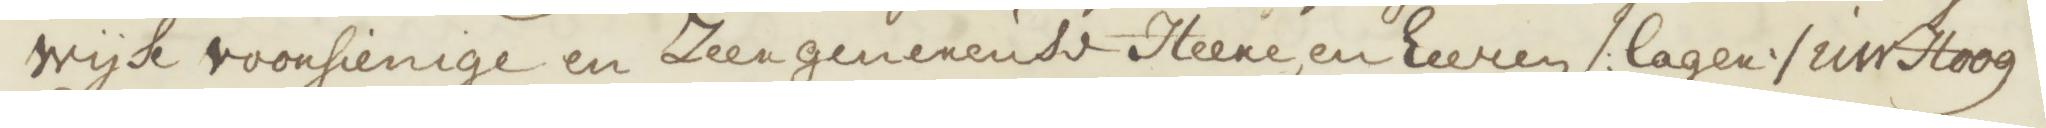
wijse voorsienige en zeer genereuse Heere, en heeren /:lager:/ uw Hoog
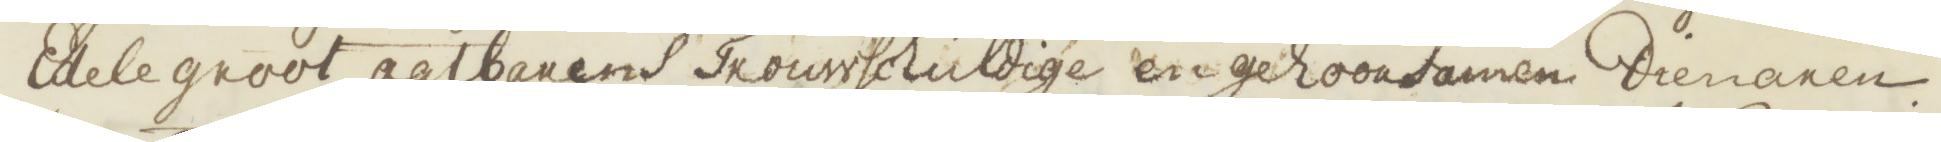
Edele groot agtbarens Trouwschuldige en gehoorsamen dienaren,
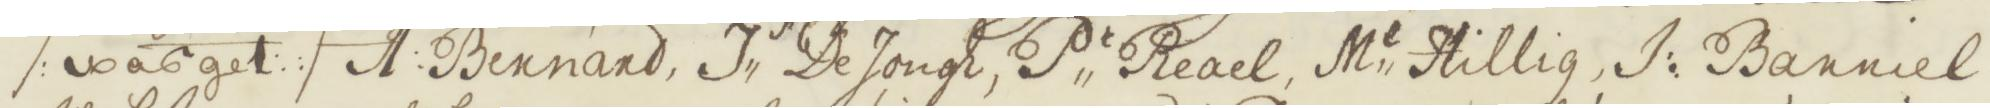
/:was get:/ A: Bernard, J„s De Jongh, P„r Reael, M„l Hillig, I: Barriel
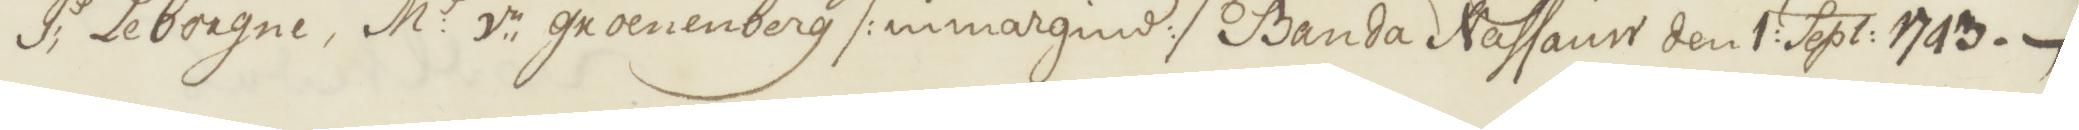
I:s Leborgne, M:s v„n groenenberg /:in margine:/ Banda Nassauw den 1:' Sept: 1743.—
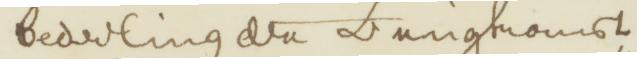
bedeeling der terugkomst
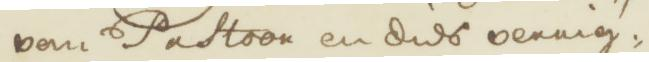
van Pastoor en dies verrig„
